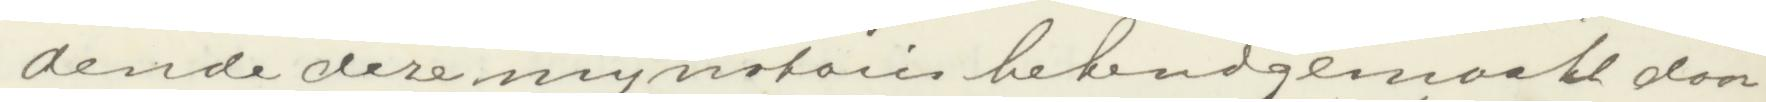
dende deze my notaris bekendgemaakt door
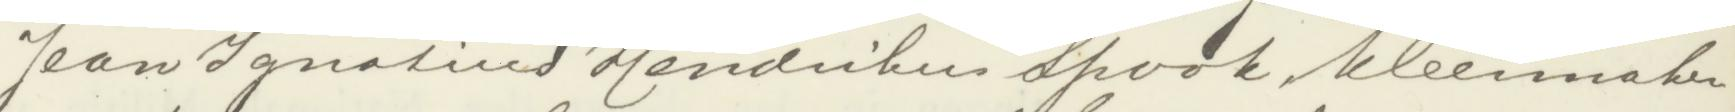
Jan Ignatius Hendrikus Spook, kleermaker
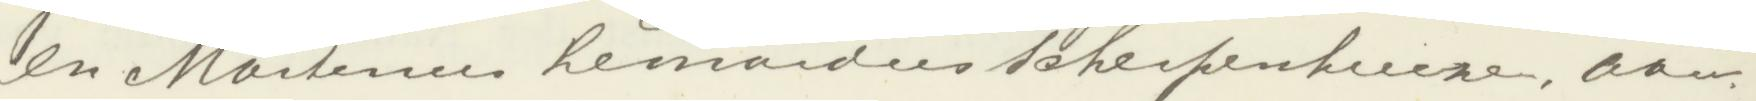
en Martinus bernardus Scherpenhuizen, aan„
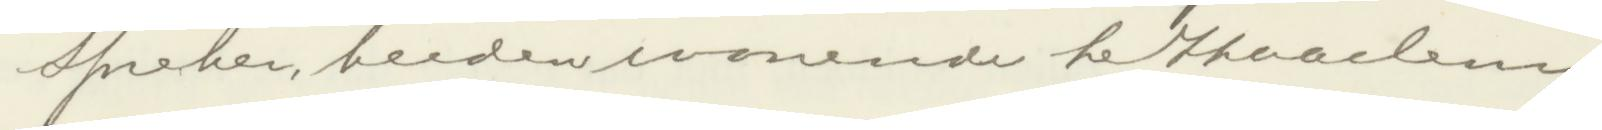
spreker, beiden wonende te Haarlem
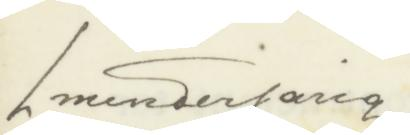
¶ minderjarig
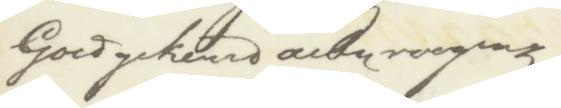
Goedgekeurd de byvoeging
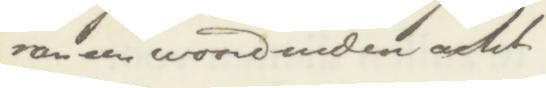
van een woord inden acht
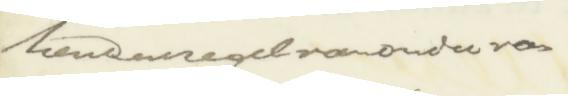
tienden regel van onder van
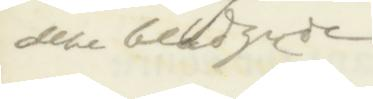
deze bladzyde
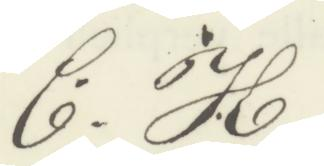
C. H..
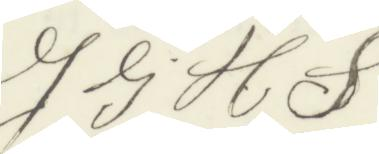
J G H S
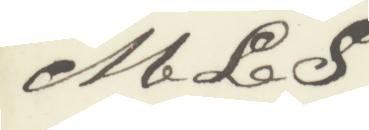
M L S
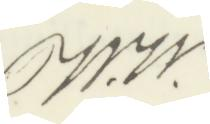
W.W.
